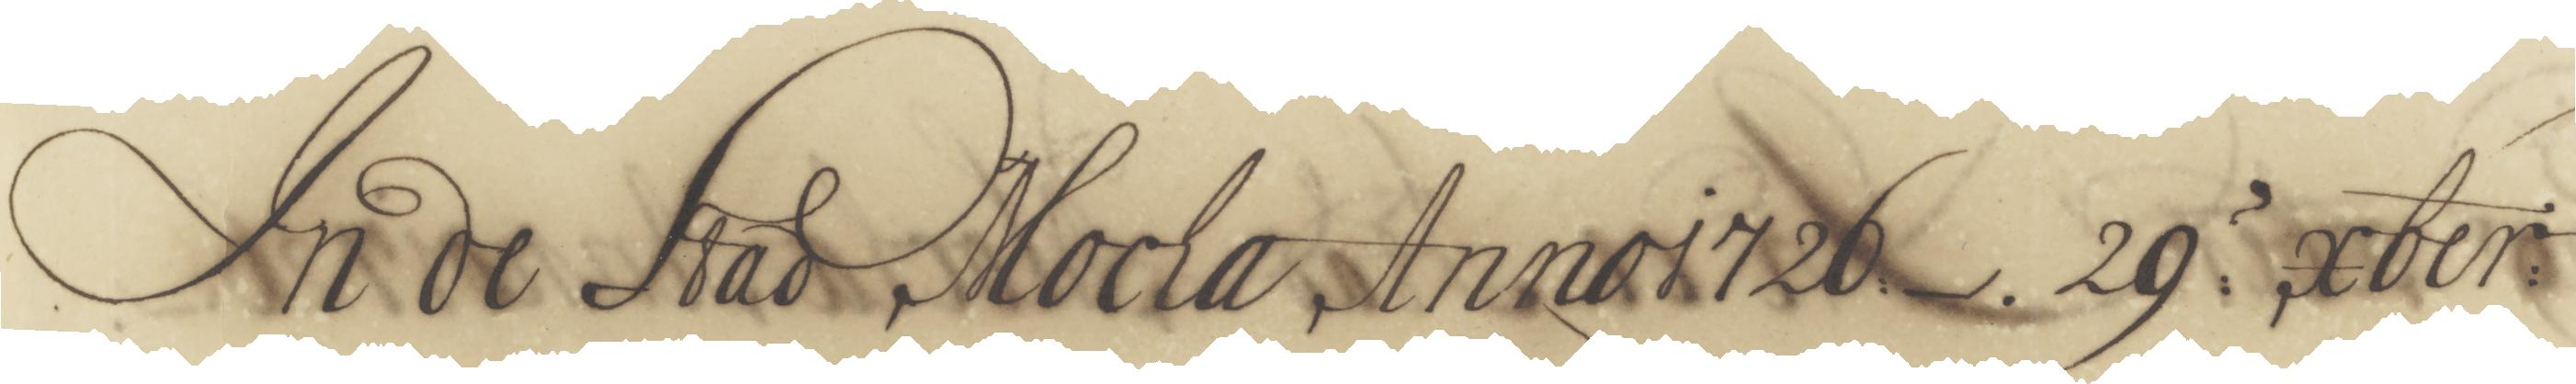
In de Stad Mocha Anno 1726: —. 29:' xber:
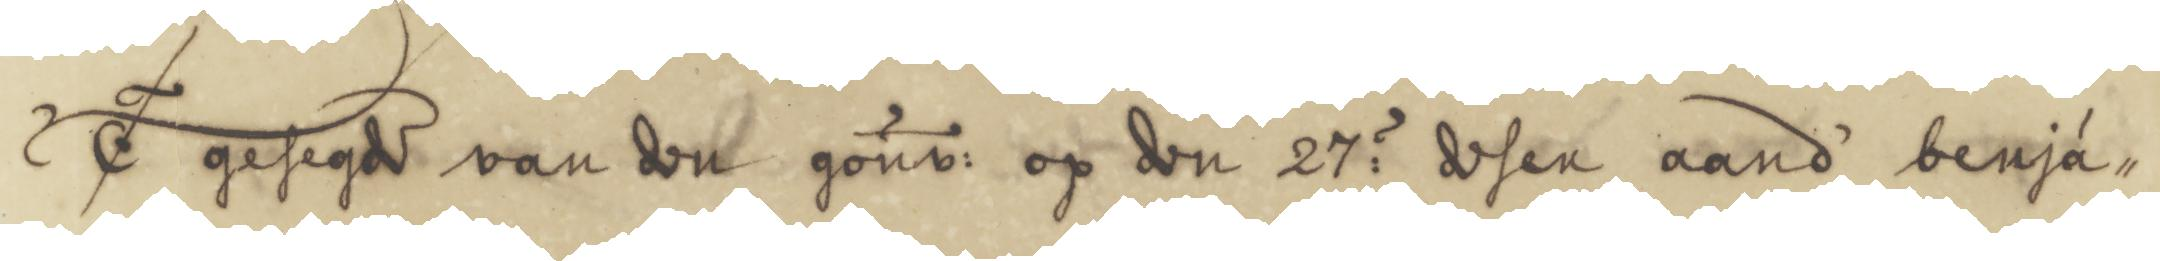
'T gesegde van den gouv: op den 27:' deser aand’ benja„
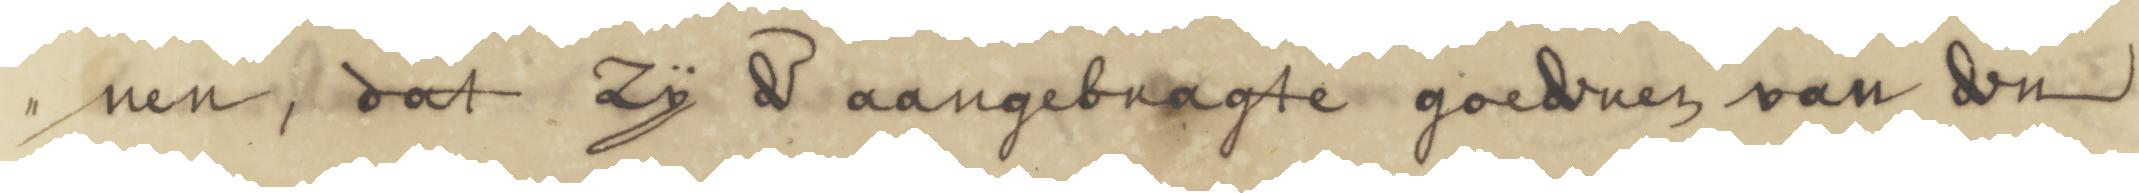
„nen, dat zij de aangebragte goederen van den
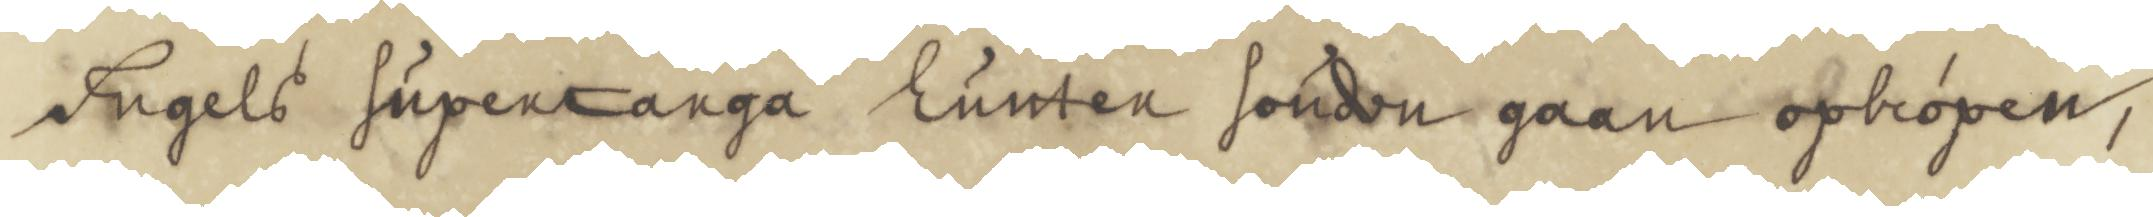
Engels supercarga hunter souden gaan opkopen,
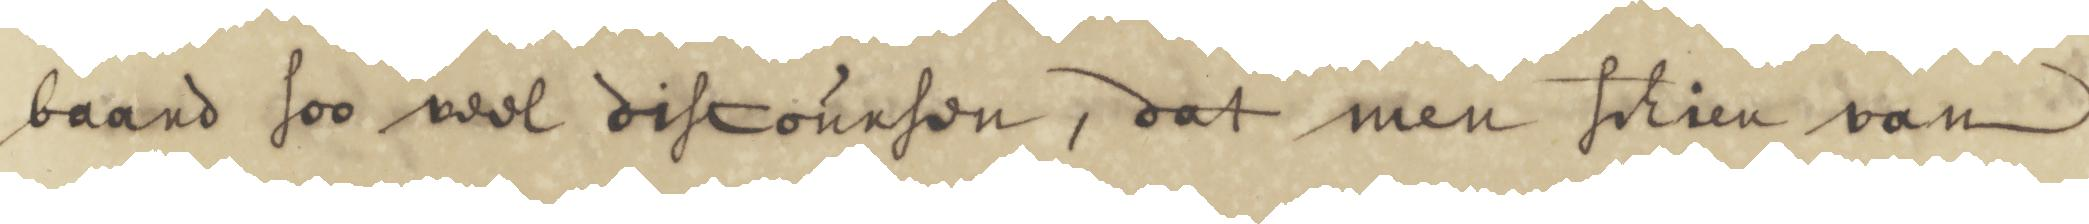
baard soo veel discoursen, dat men schier van
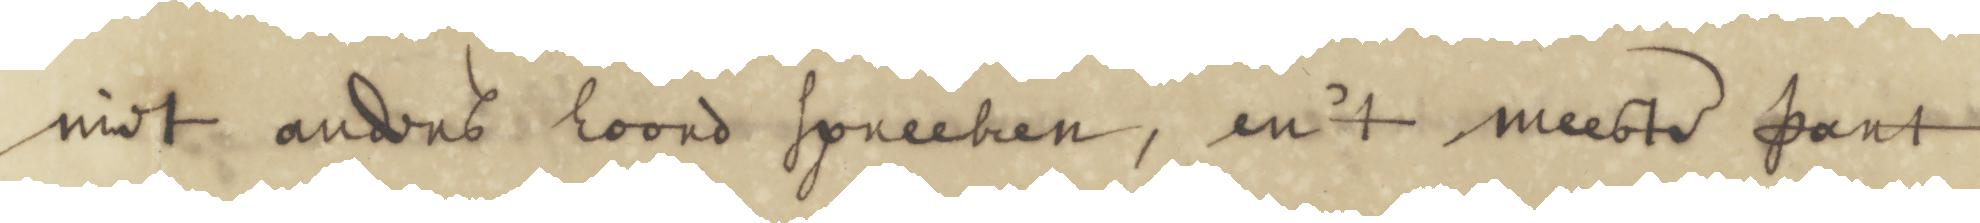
niet anders hoord spreeken, en ’t meeste part
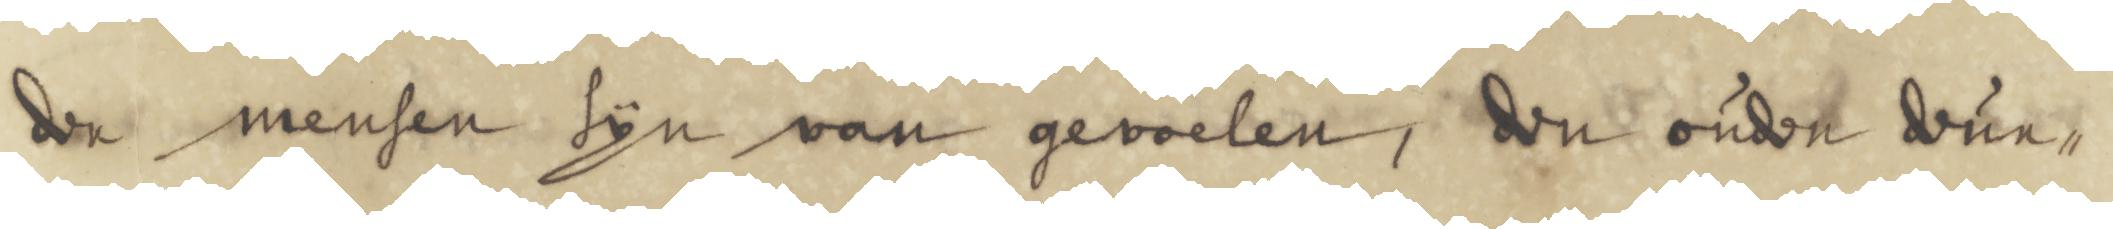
der mensen sijn van gevoelen, den ouder deur„
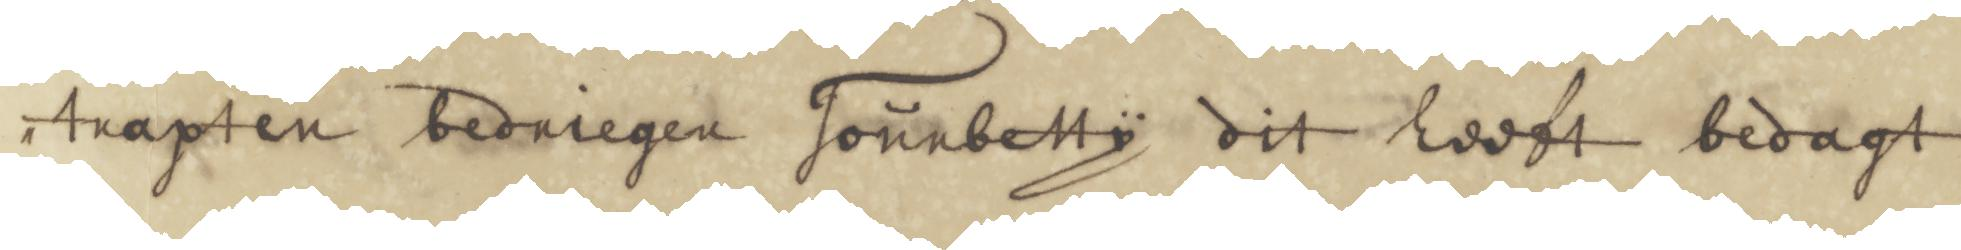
„trapten bedrieger Tourbettij dit heeft bedagt
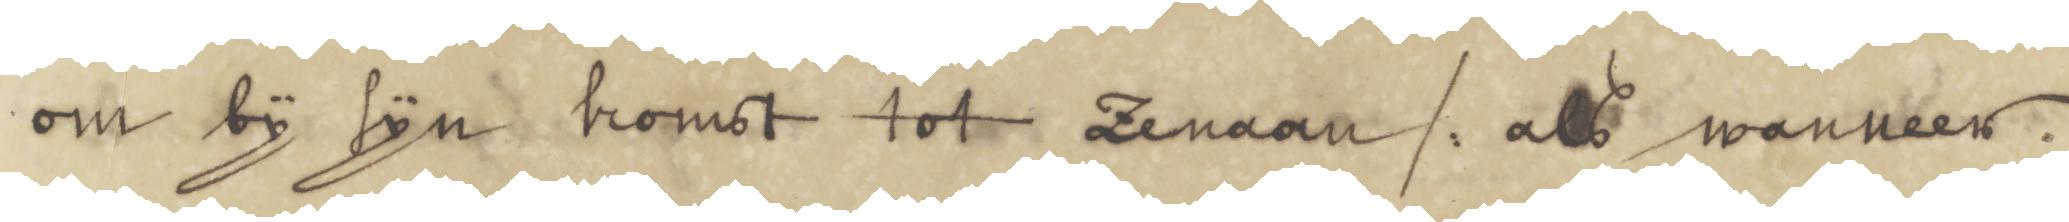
om bij sijn komst tot zenaan /: als wanneer
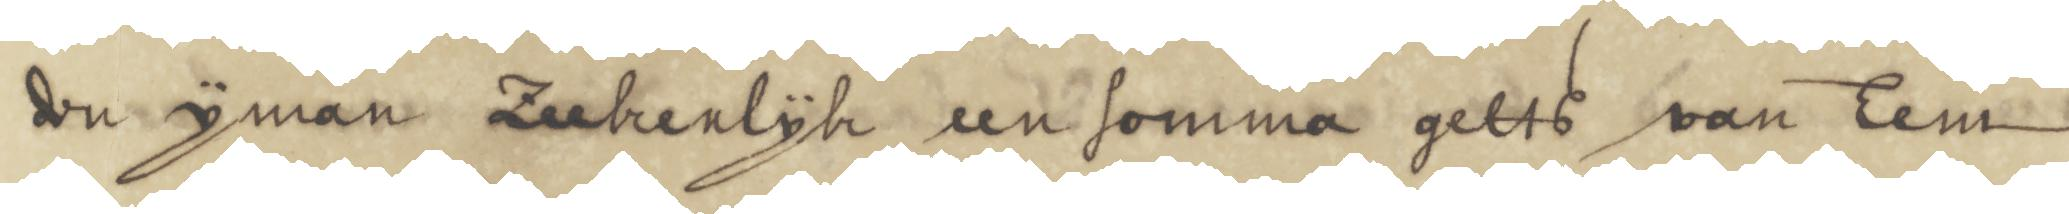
den ijman zeekerlijk een somma gelts van hem
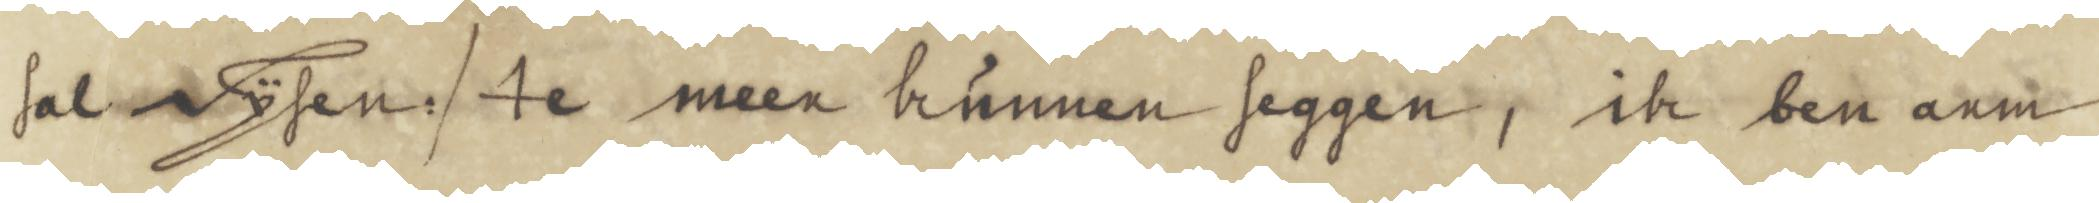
sal Eijsen:/ te meer kunnen seggen, ik ben arm
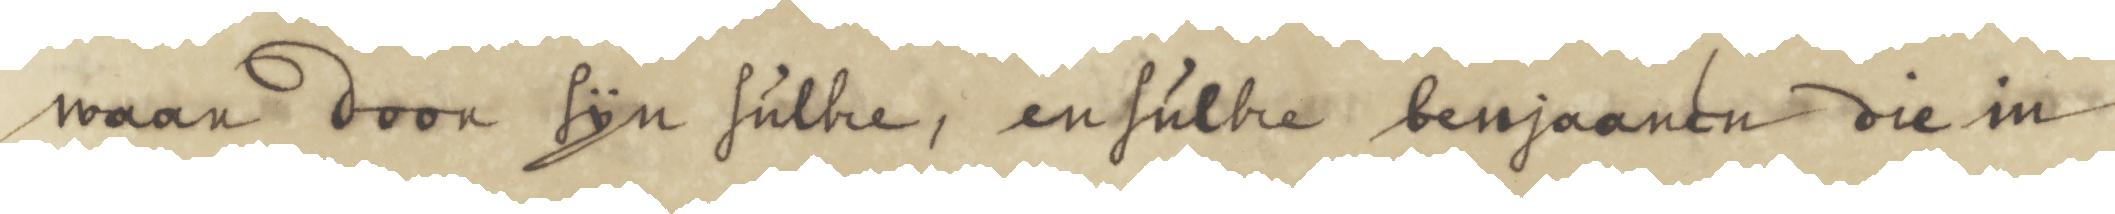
waar door sijn sulke, en sulke benjaanen die in
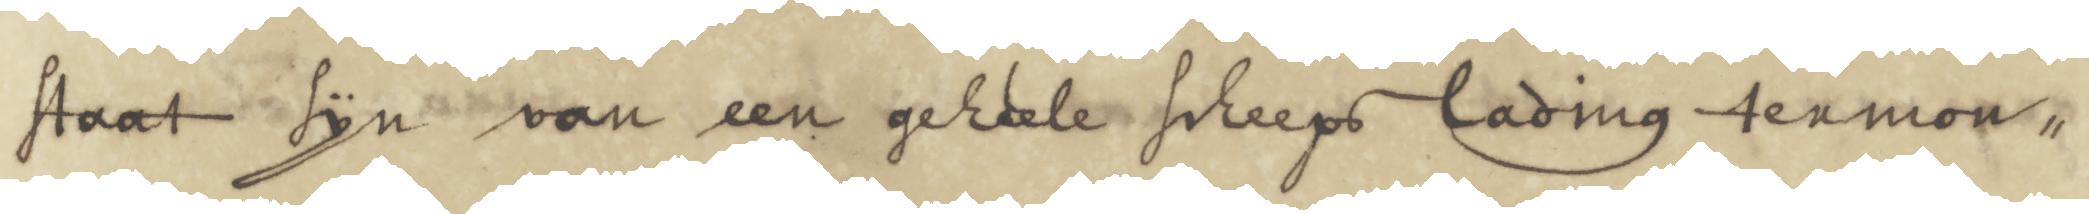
staat sijn van een geheele scheeps lading termon„
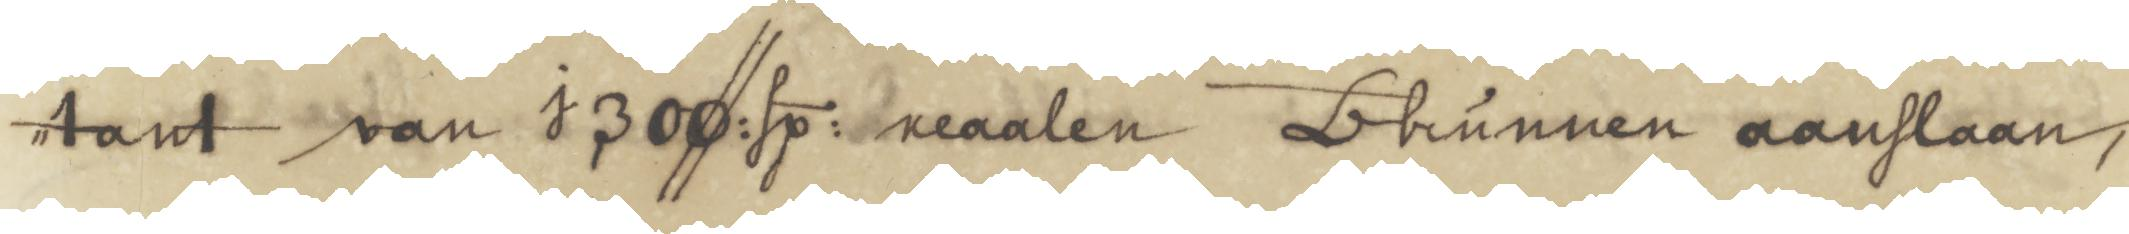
„tant van 130Ø: sp: reaalen tekunnen aanslaan,
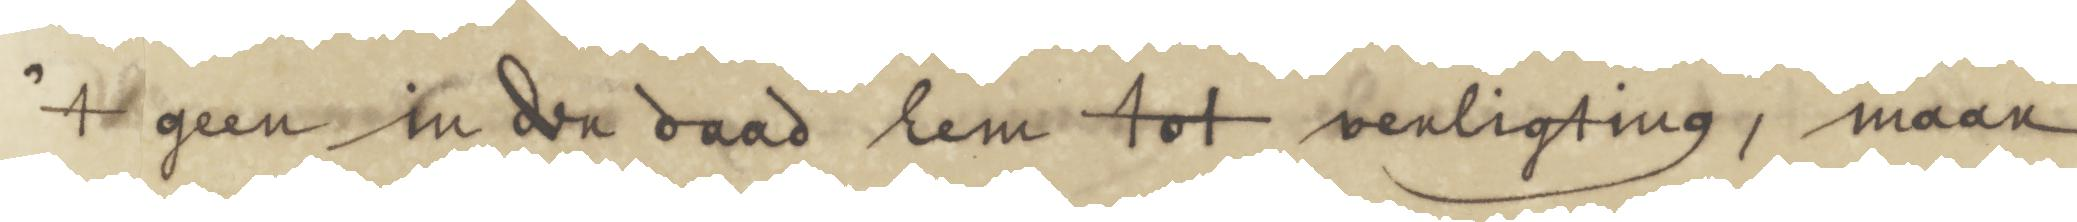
’t geen in der daad hem tot verligting, maar
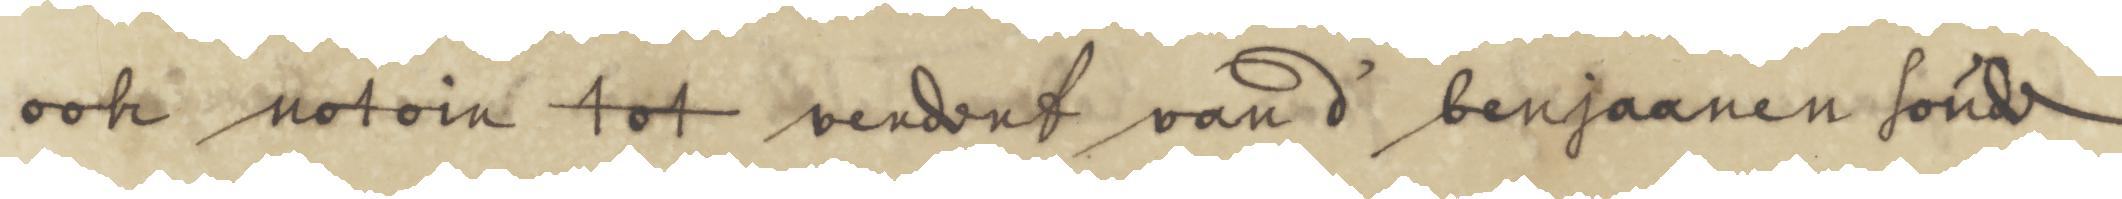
ook notoir tot verderf van d’ benjaanen soude
